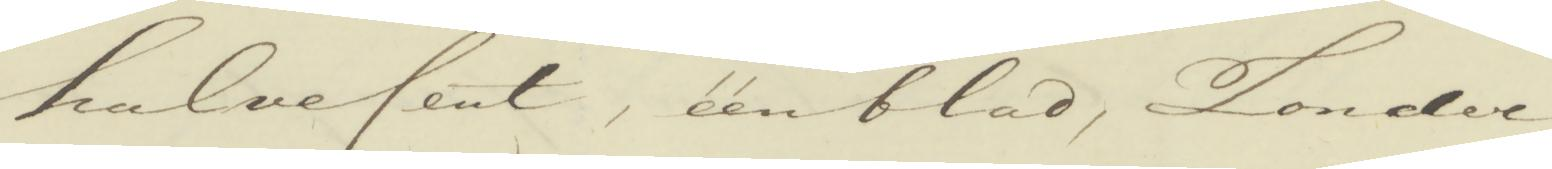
halveCent, één blad, Zonder
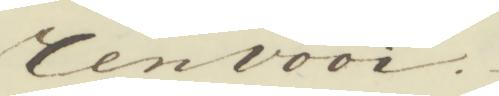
renvooi.
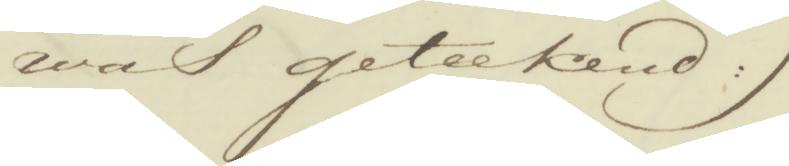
(was geteekend:)
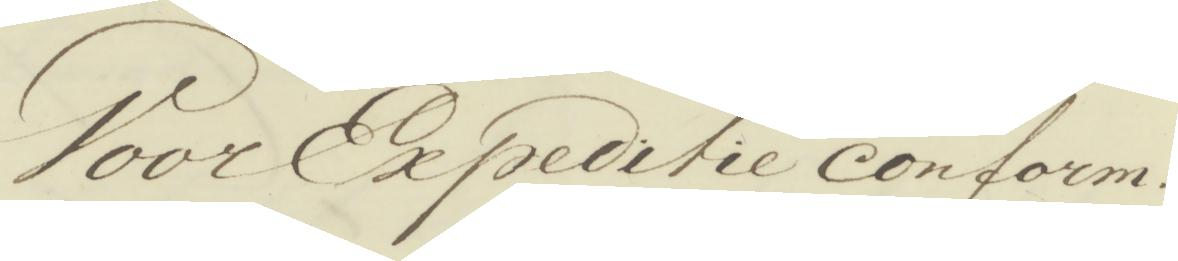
Voor Expeditie conform.
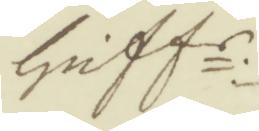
Griff=
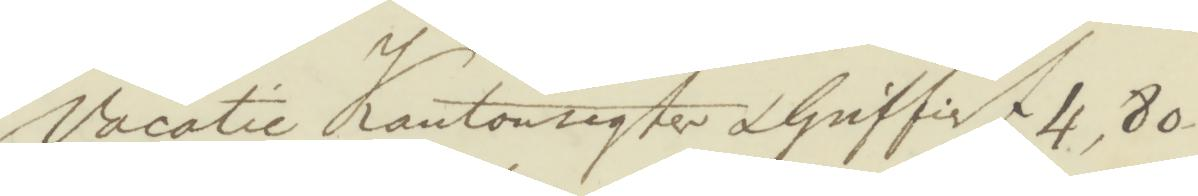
Vacatie Kantonregter & Griffier ƒ 4,80
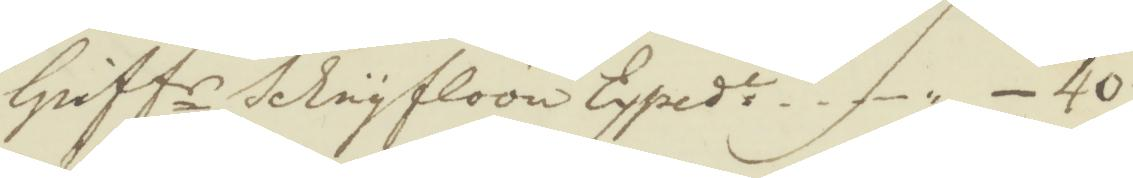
Griff=s schrijfloon Exped=e - - - - „ — 40
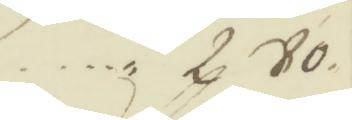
. . . . „ 2 80
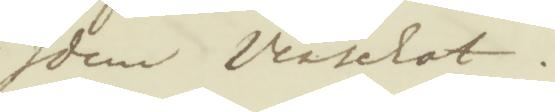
Jdem Verschot .
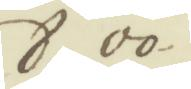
8,00-
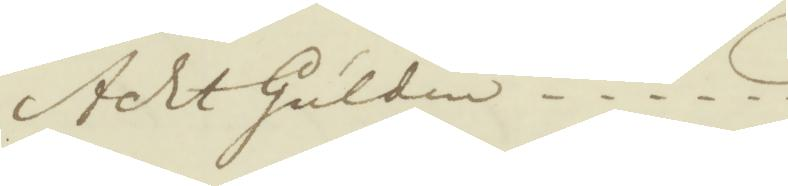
Acht Gulden - - - - -
